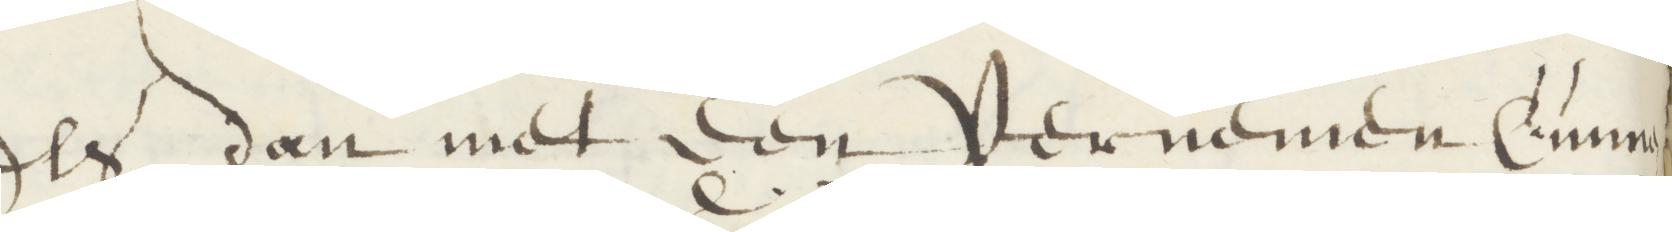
Als dan met een vernemen Cunne
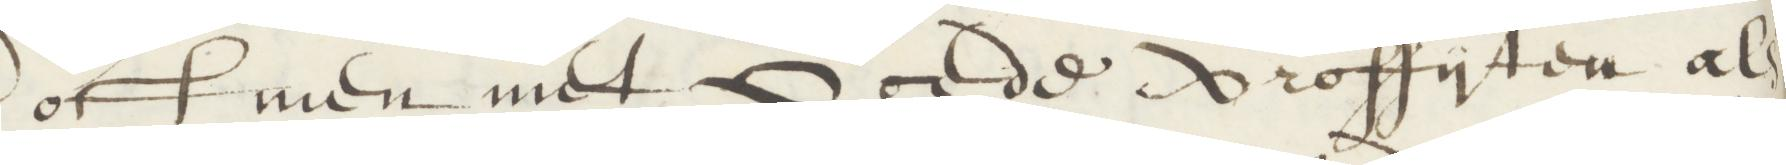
off men met Goede proffijten als
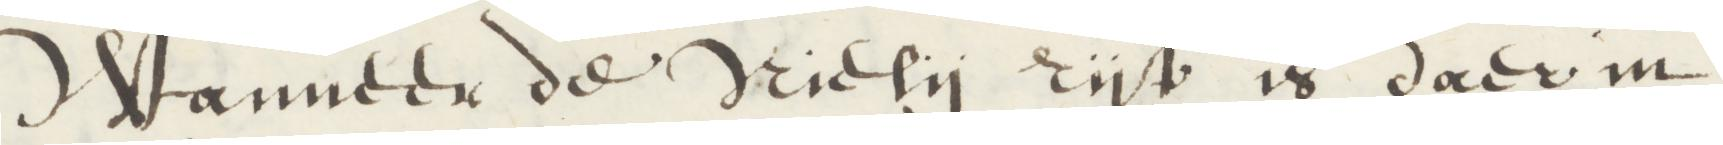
Wanneer de Nielij rijp is daer in
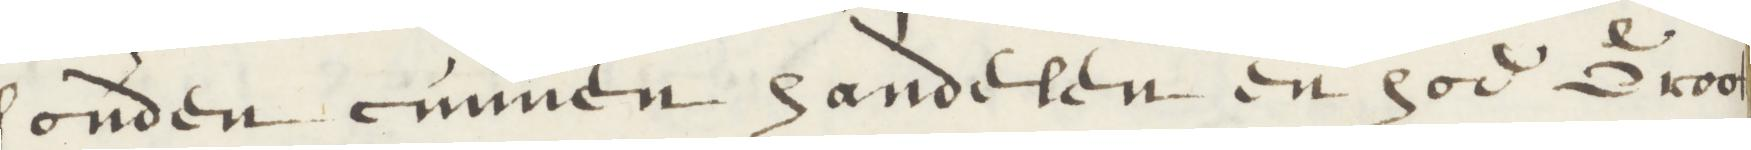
souden cunnen handelen en hoe Groot
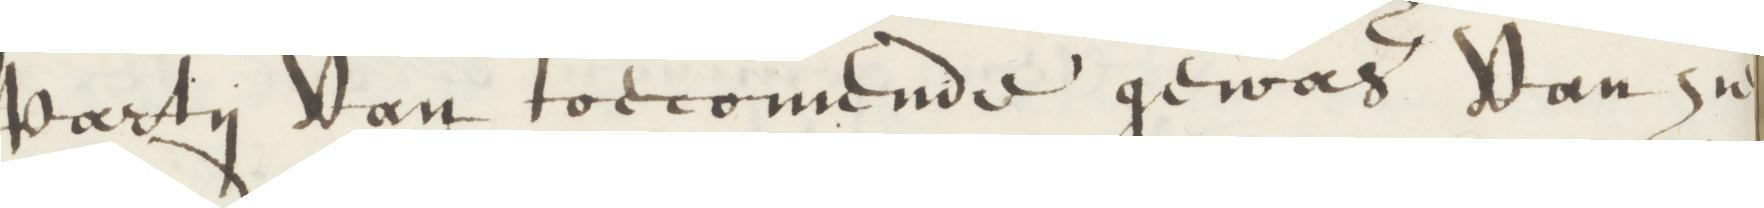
partij van toecomende gewas van hie
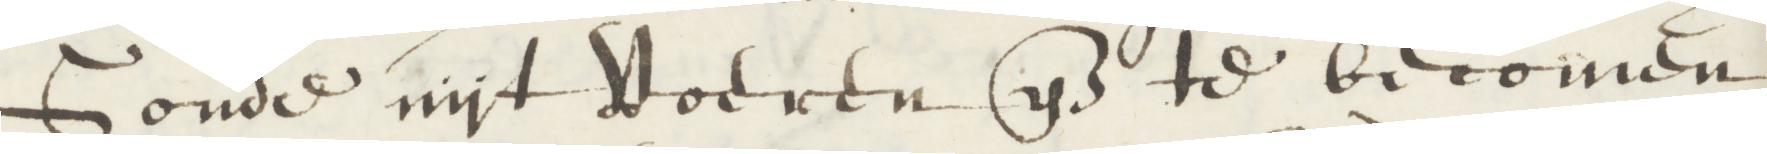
Sonde uijt voeren ende te becomen
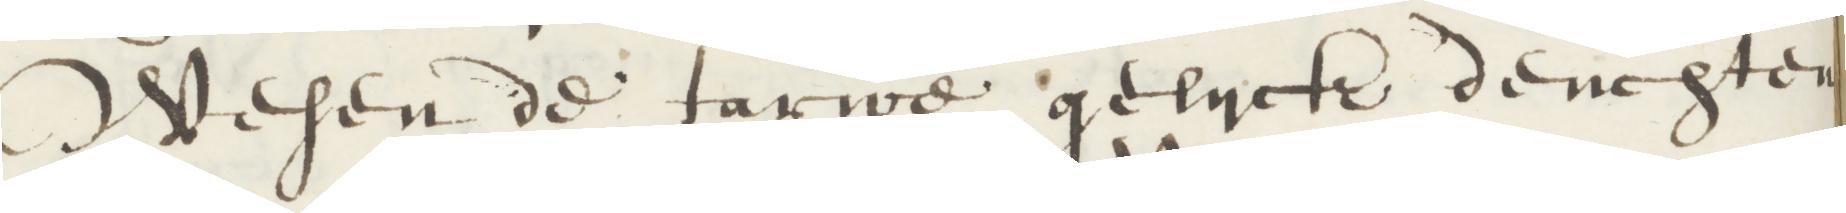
wesen de tarwe gelyck deuchten
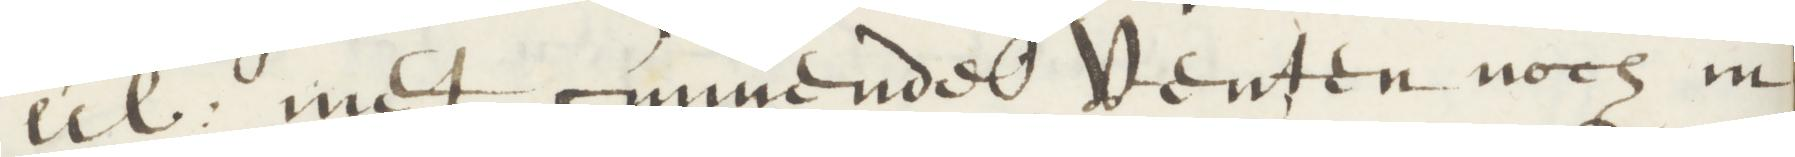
ul: niet cunnende venten noch in
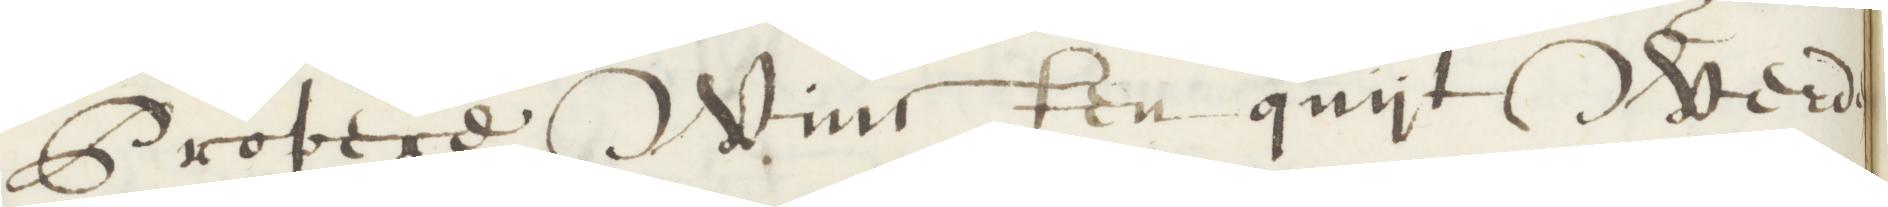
Propere Winsten quijt werde
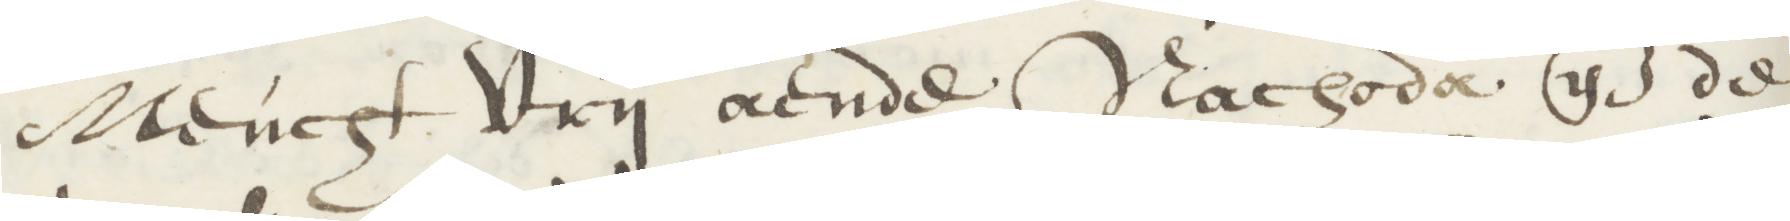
Meucht vrij aende nachoda ende de
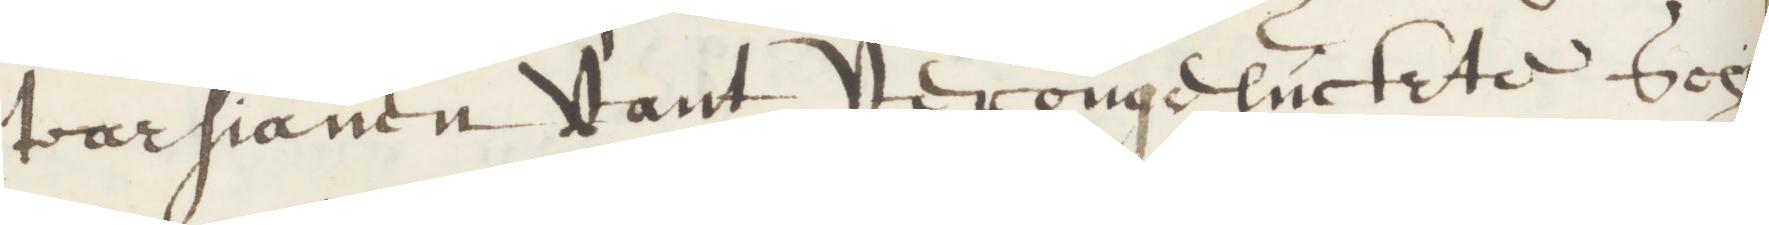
parsianen vant verongeluckte schi
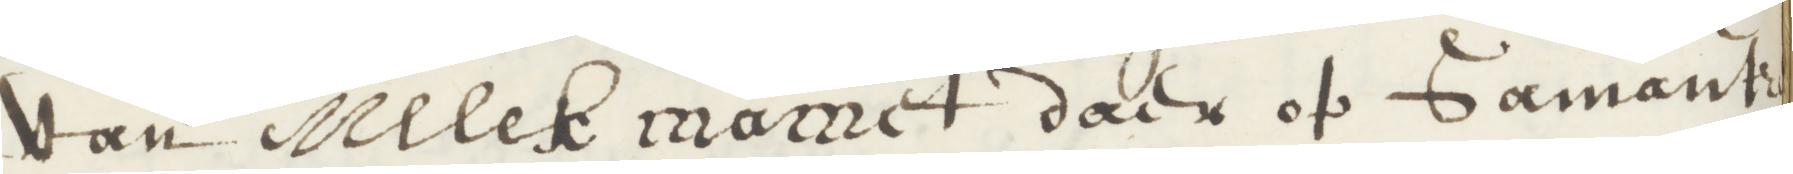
van Mllek mamet daer op Samanth
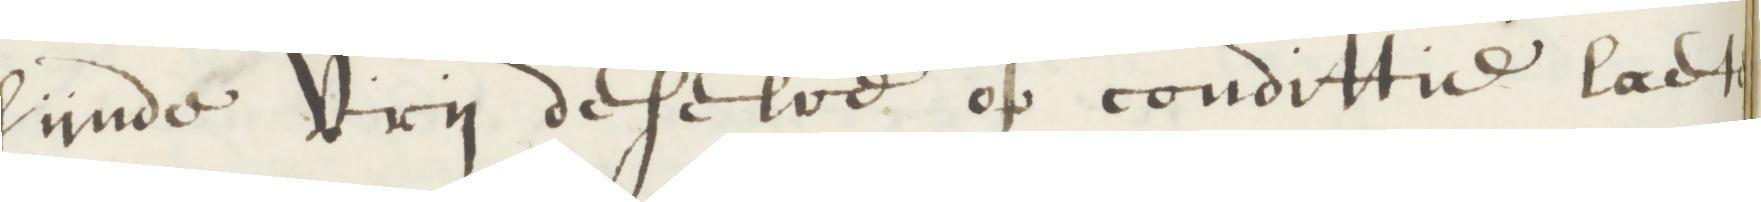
sijnde vrij deselve op condittie laete
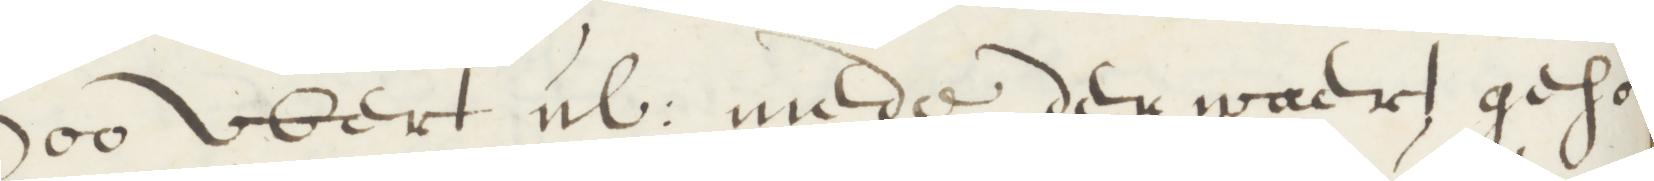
Soo wert ul: mede der waert geson
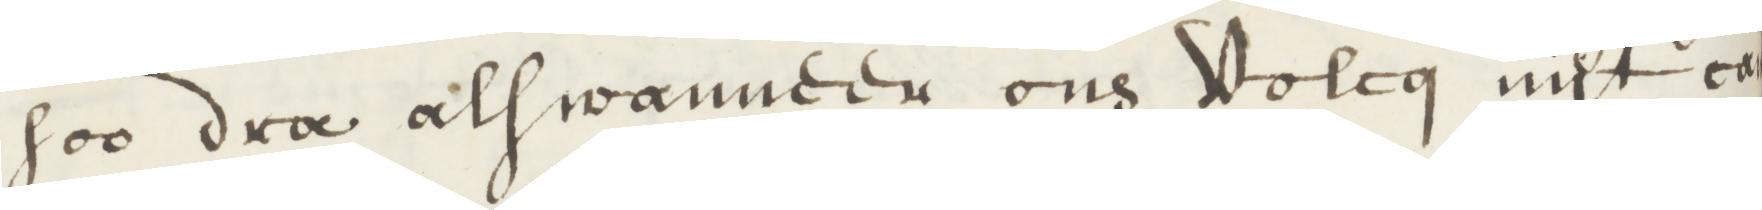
soo dra als wanneer ons volcq uijt ca
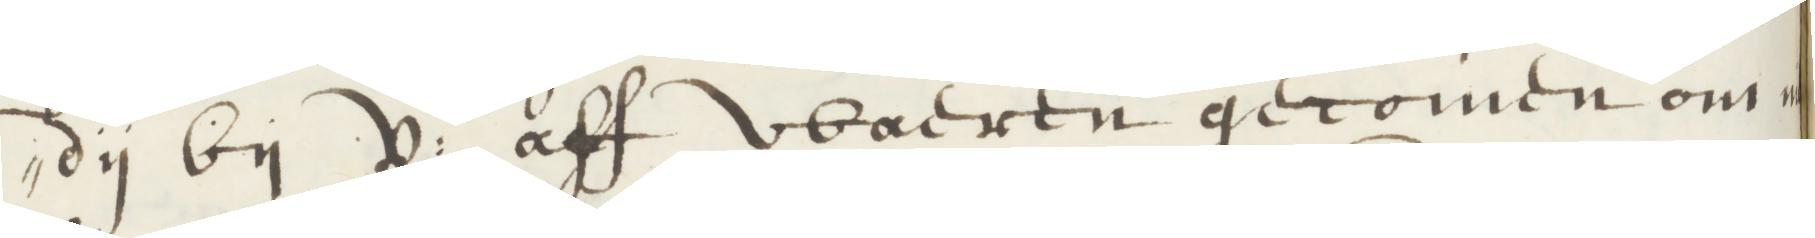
„dij bij v: aff waeren gecomen om in
